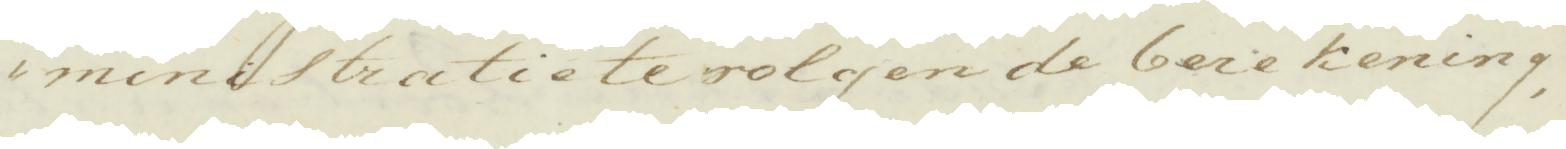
„ministratie te volgen de berekening,
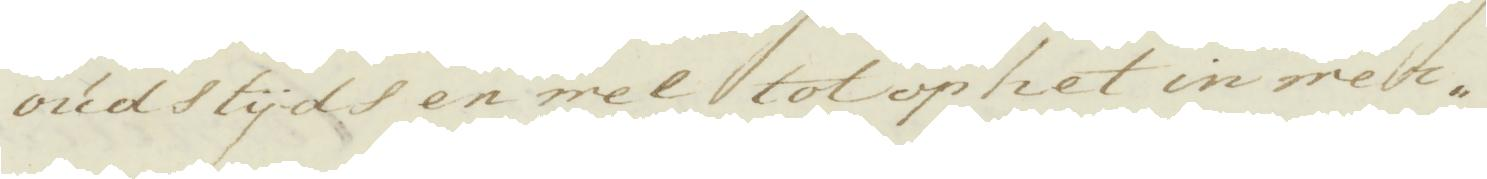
oudstijds en wel tot op het in wer„
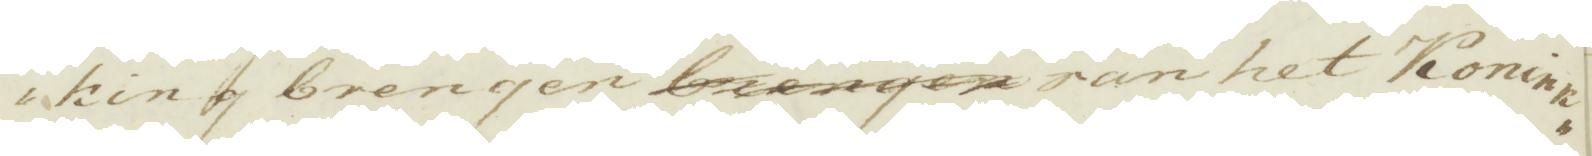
„king brengen brengen van het Konink„
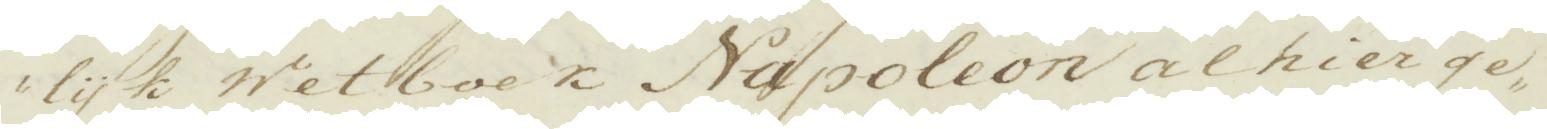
„lijk wet boek Napoleon alhier ge„
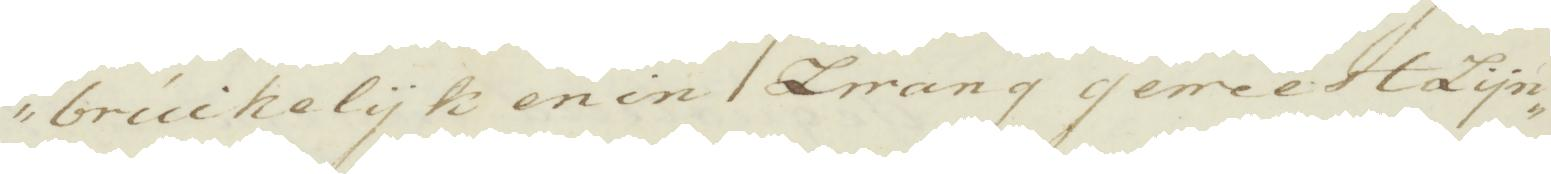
„bruikelijk en in Zwang geweest Zijn„
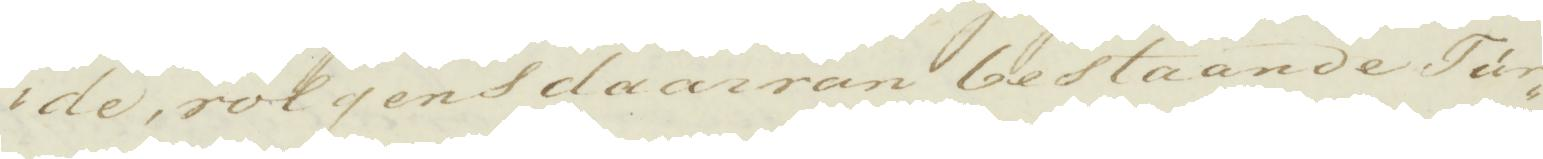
de, volgens daarvan bestaande Tur„
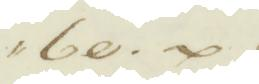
be.
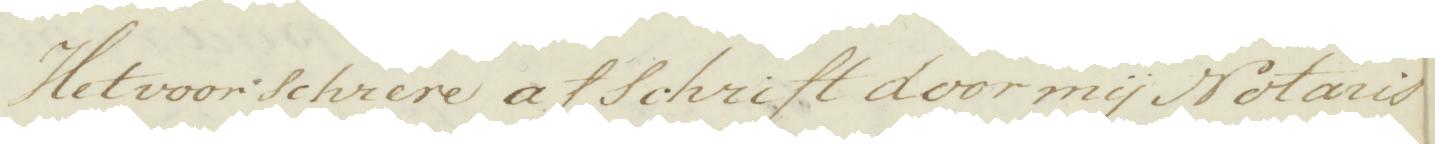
Het voor schreve afschrift door mij Notaris
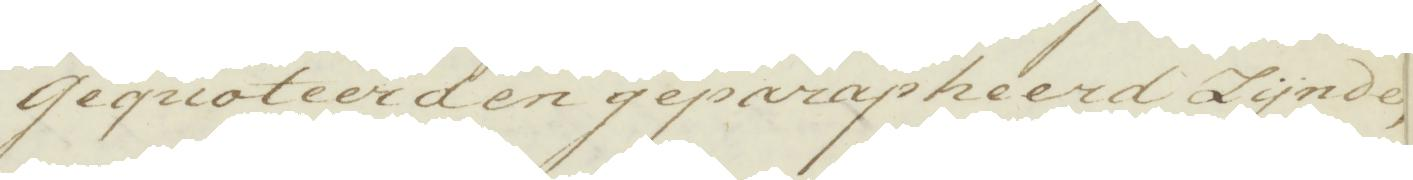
gequoteerd en geparapheerd zijnde,
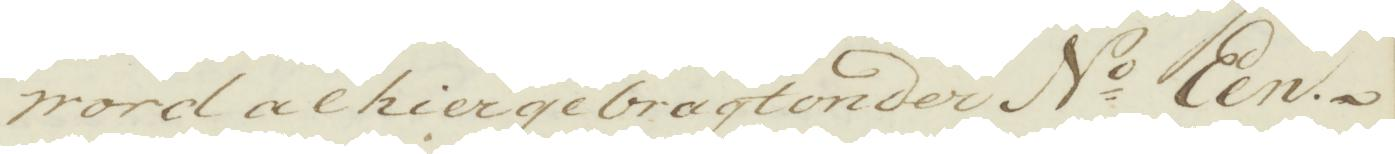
word alhier gebragt onder N=o Een.
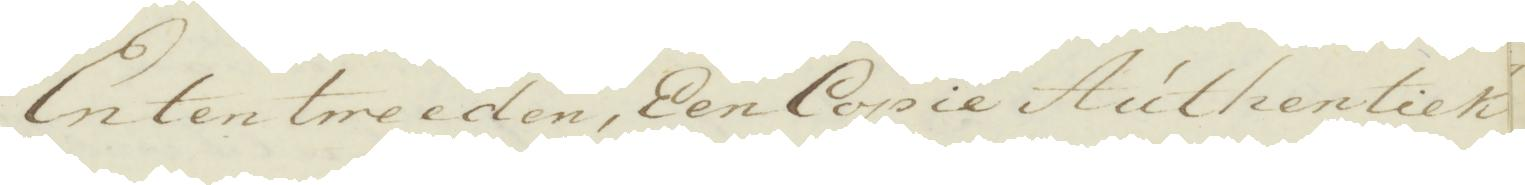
En ten tweeden, Een Copie Authentiek
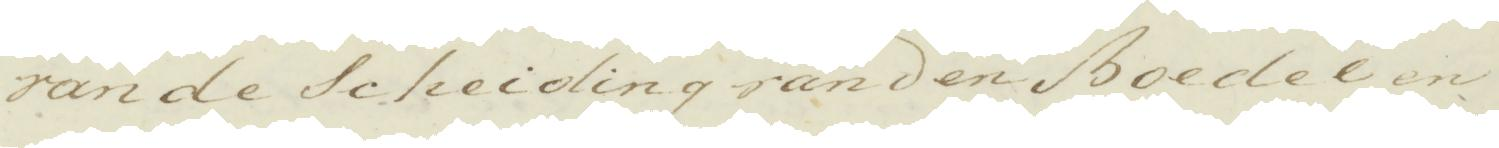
van de scheiding van den Boedel en
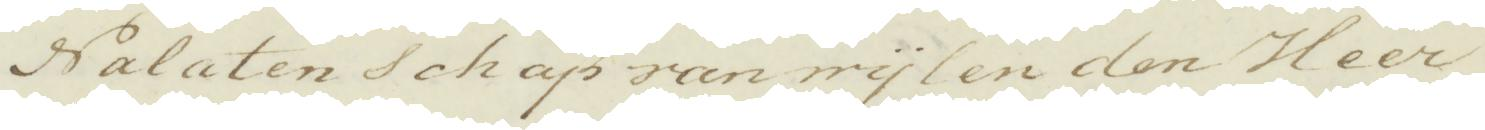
Nalatenschap van wijlen den Heer
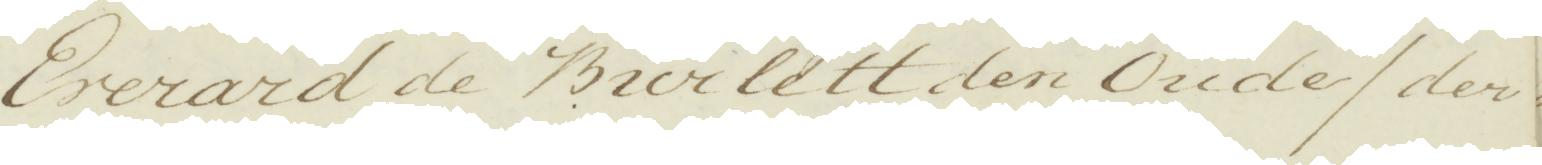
Everard de Burlett den oude / der
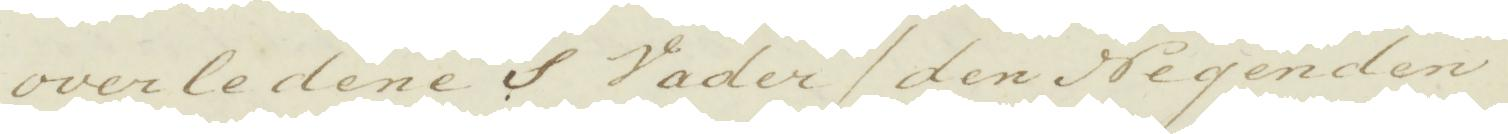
overledene 's Vader / den Negenden
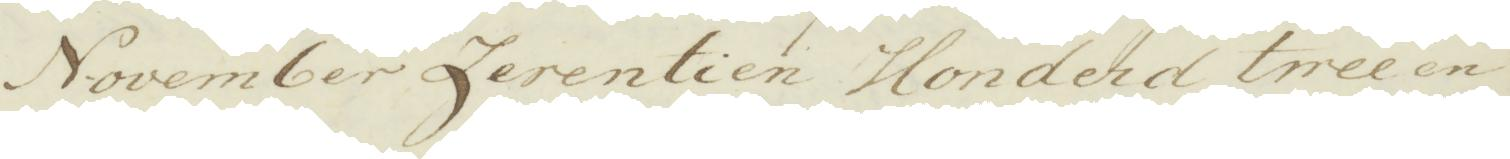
November Zeventien Honderd twee en
